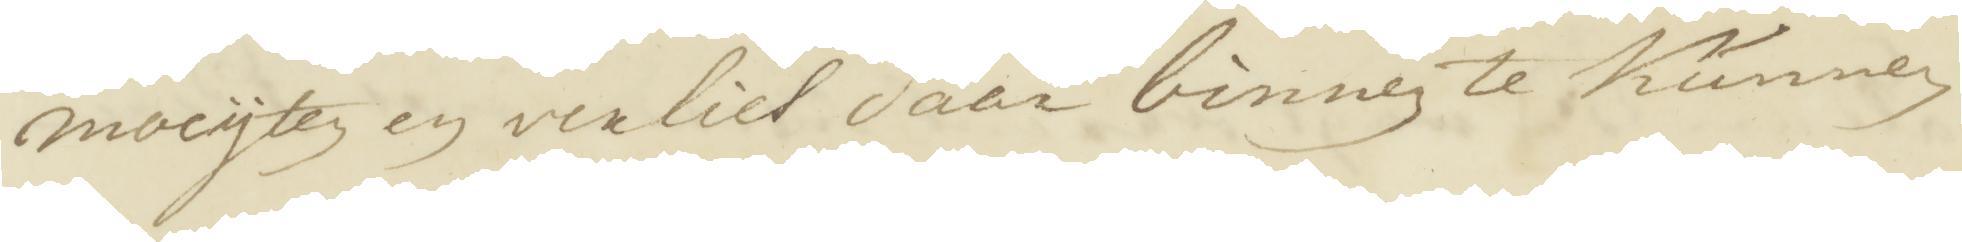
moeijten en verlies daar binnen te kunnen
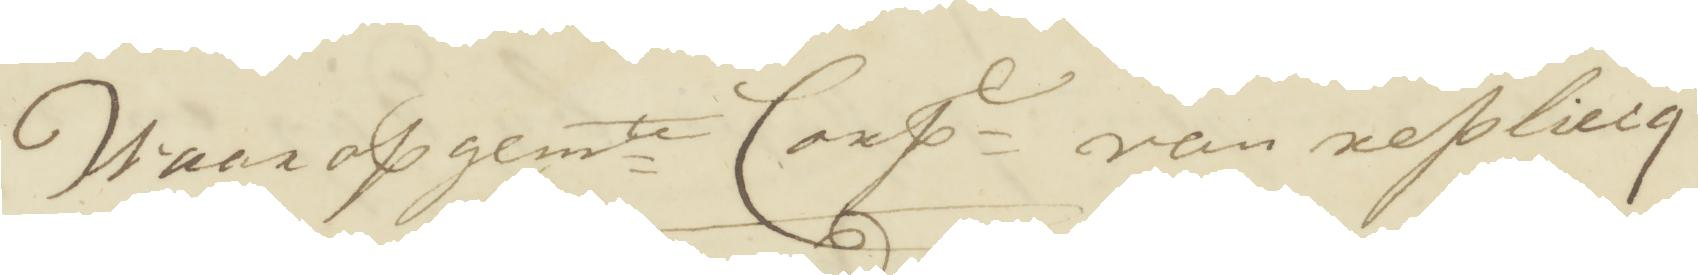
Waarop gem=te Corp=l van repliecq
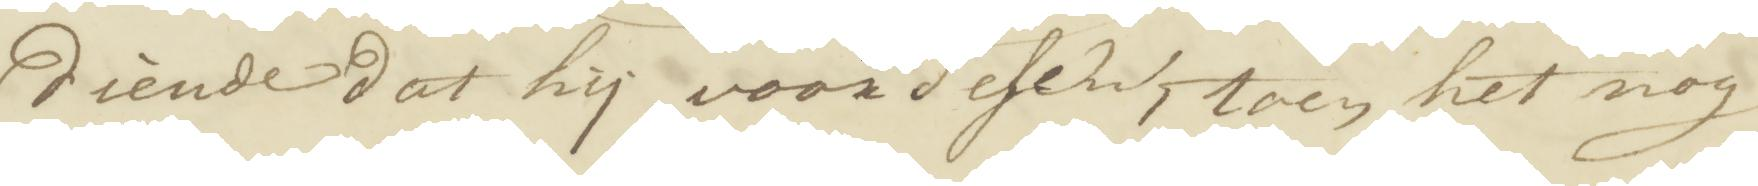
diende dat hij voor desen, toen het nog
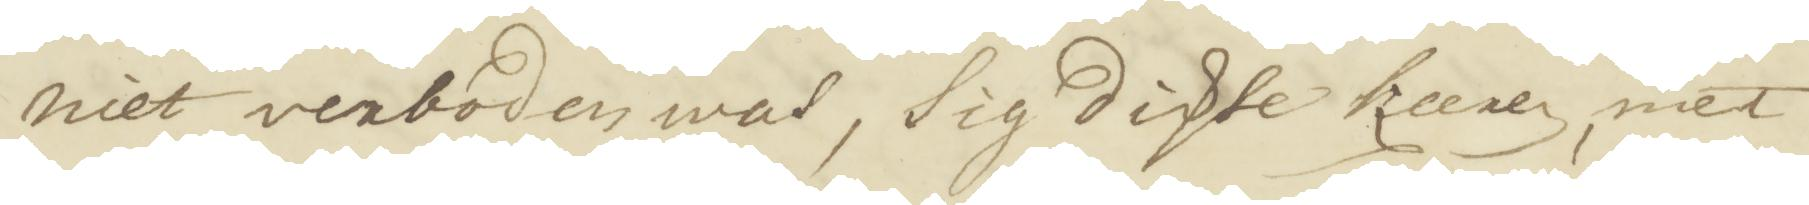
niet verboden was, sig diverse keeren, met
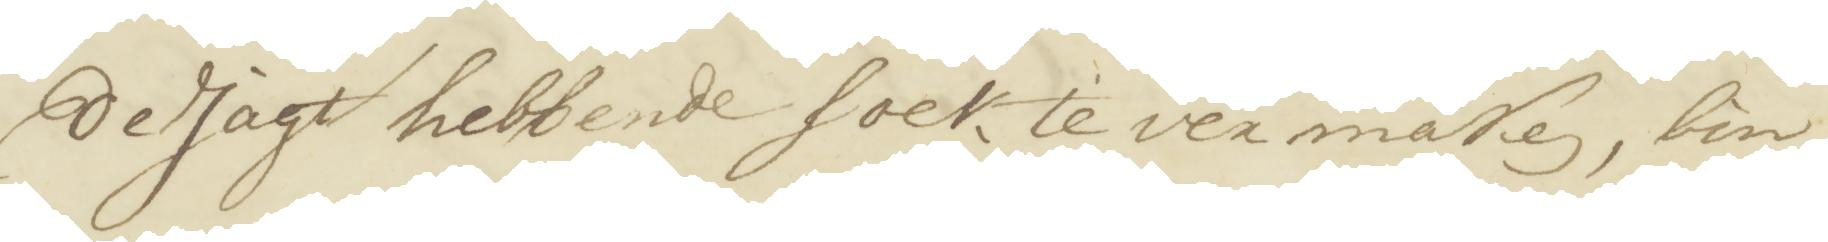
de Jagt hebbende soek te vermaken, bin
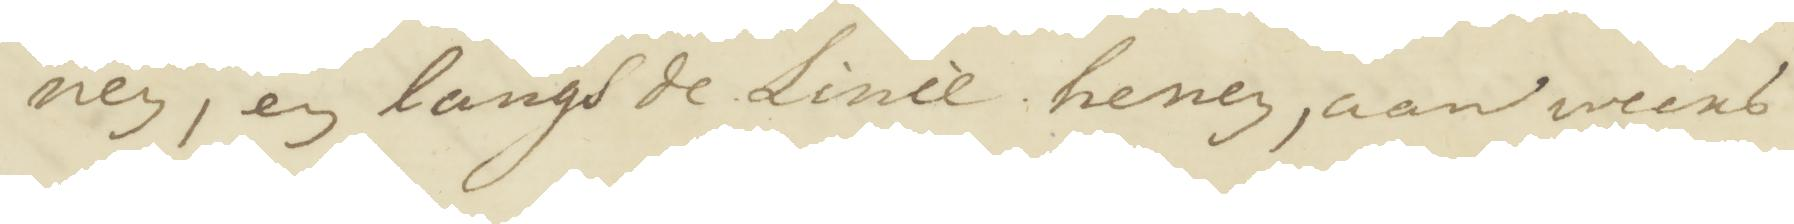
nen, en langs de Lince henen, aan weers
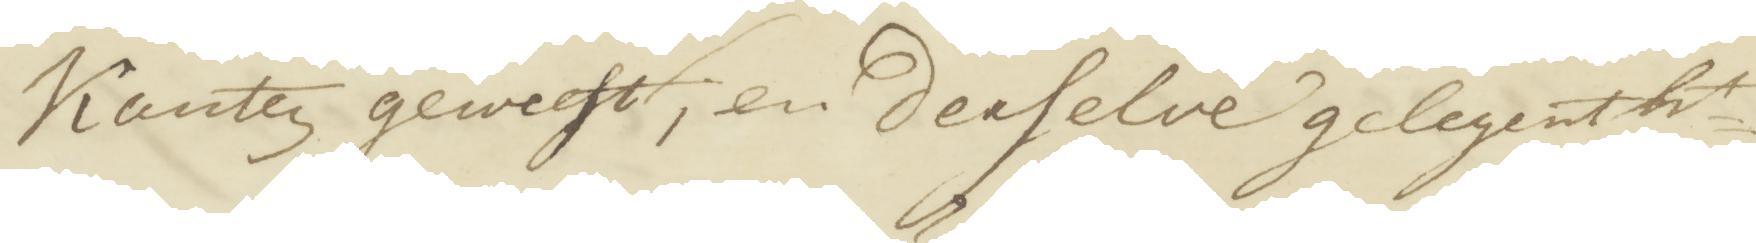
Kanten geweest, en derselve gelegenth=t
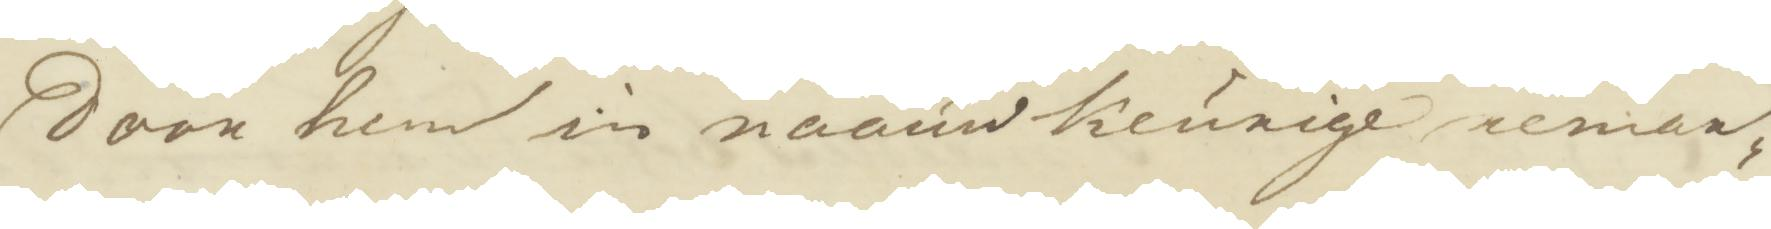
door hem in naauw keurige remar„
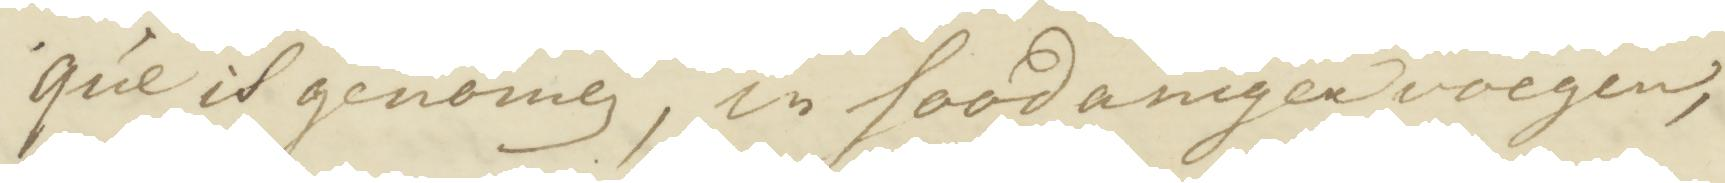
que is genomen, in soodaniger voegen,
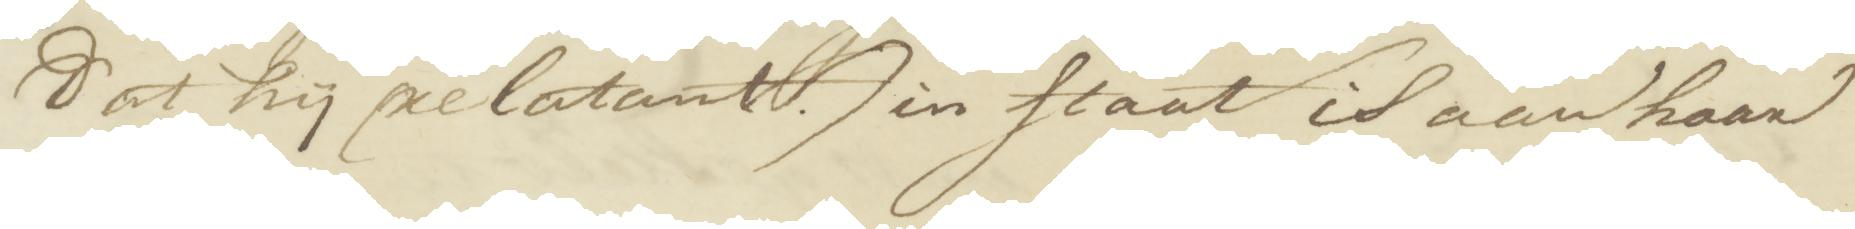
dat hij (relatants.) in staat is aan haar
